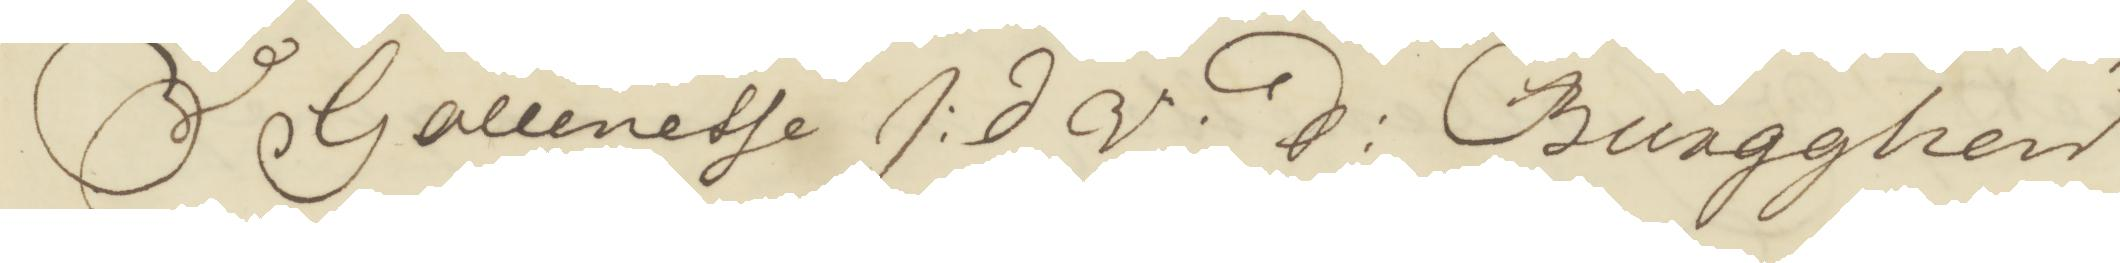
de Gollenesse J: d v: d: Burgghen
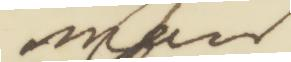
man
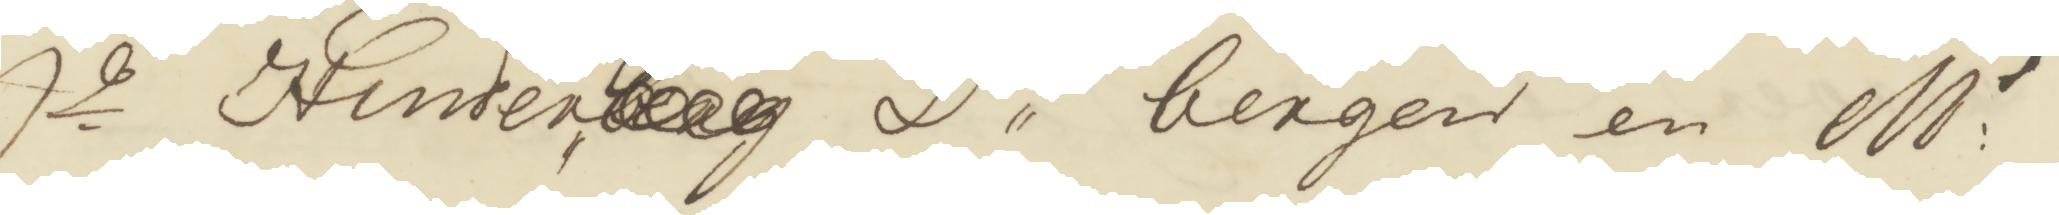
J=b Hinder„berg D„l bergen en M:s
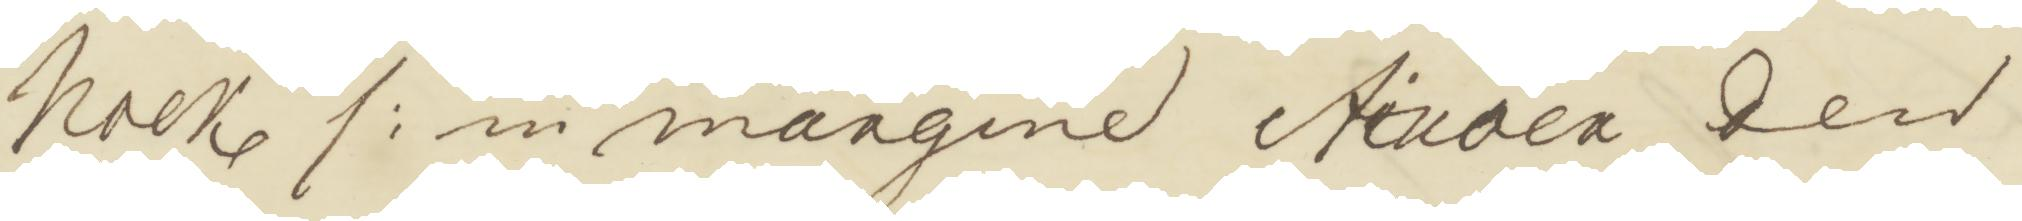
Kock /:in margine Ainoer den
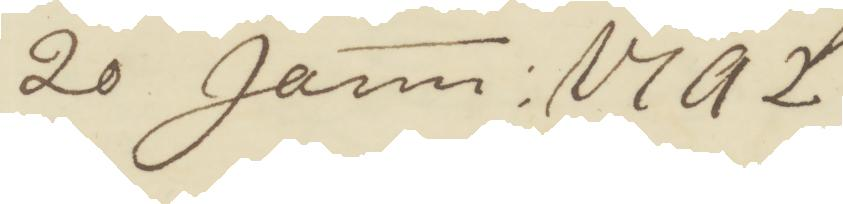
20 Jann: 1742.
